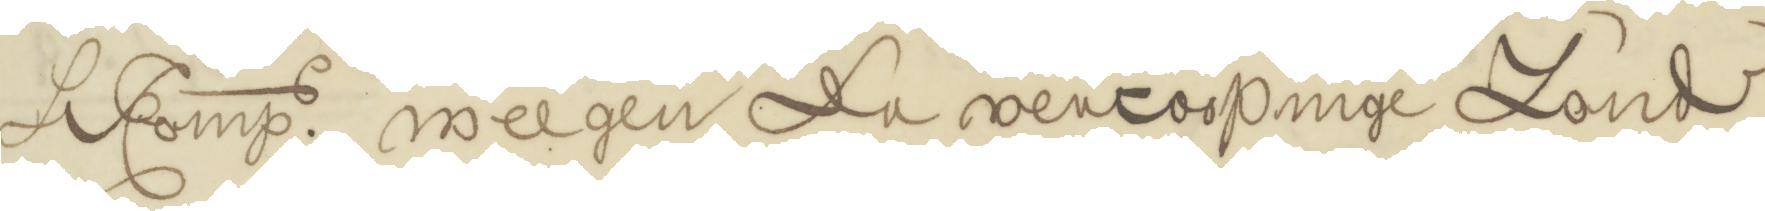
Comp.s weegen de vercoopinge Zoude
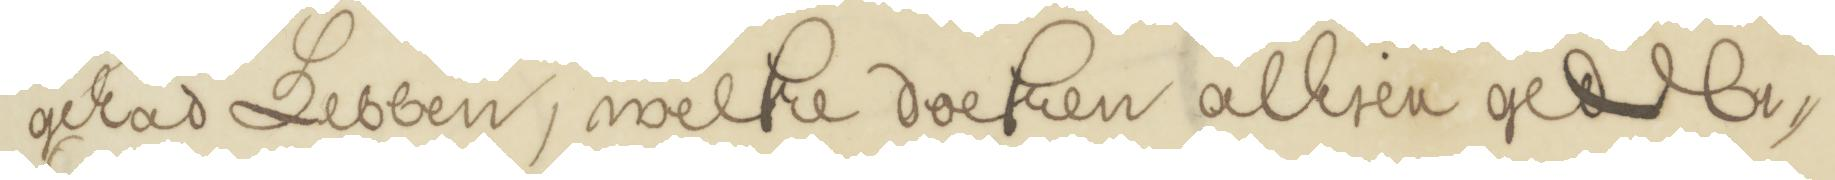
gehad hebben, welke doeken alhier gedebi„
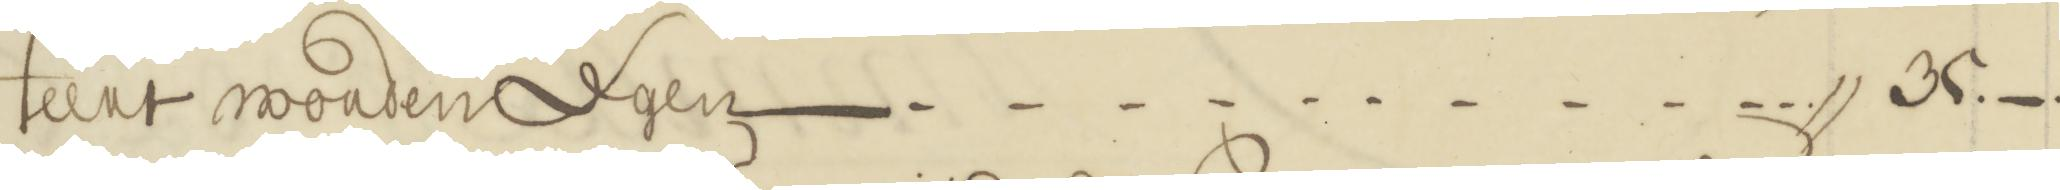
teert worden de gen - - - - - - - - - - -„ 35.–.
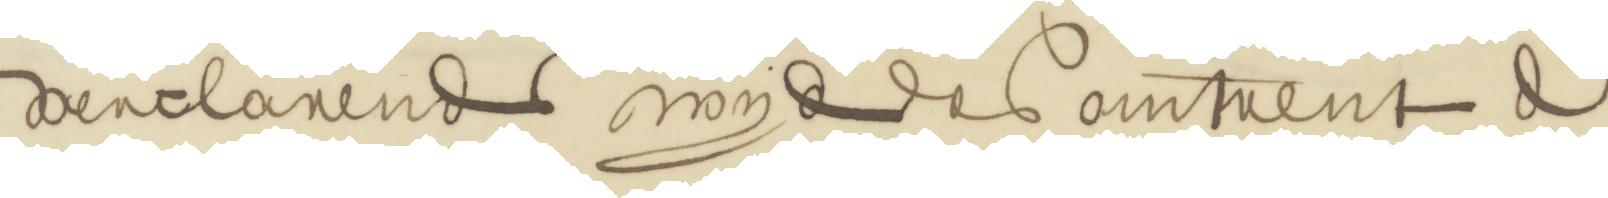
verclarende wijders omtrent de
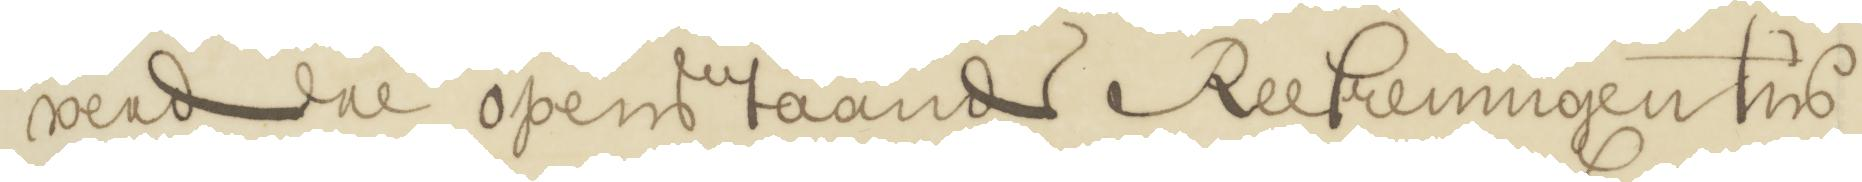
verdere openstaande Reekeningen tus
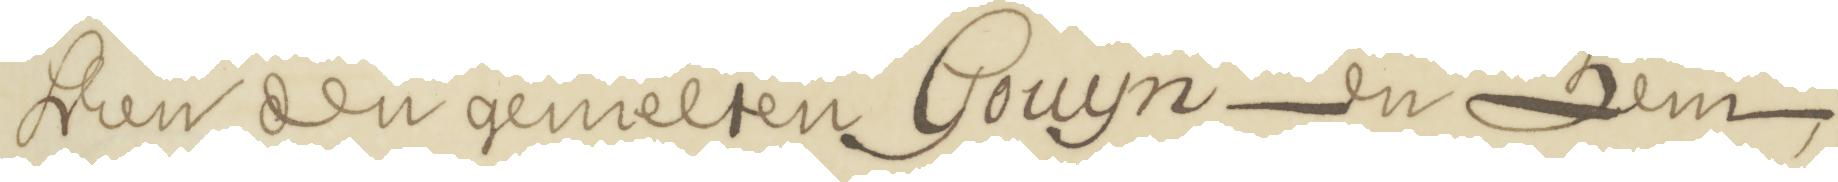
schen den gemelten Gouijn en hem,
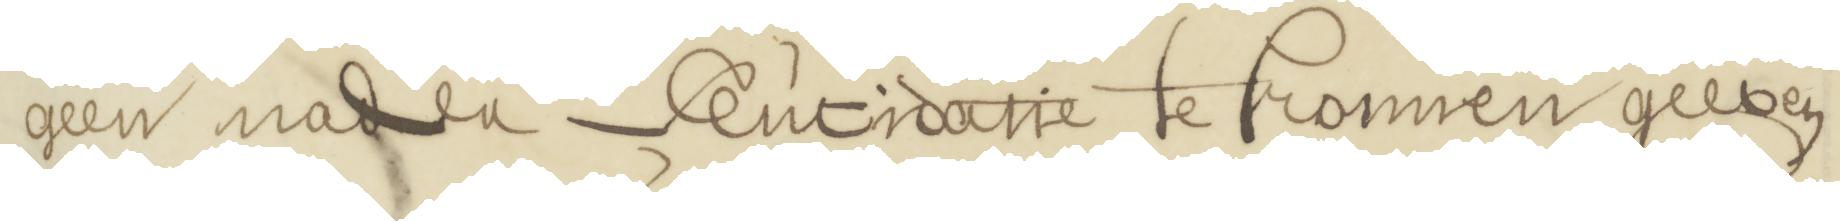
geen nader Jucidatie te konnen geeven
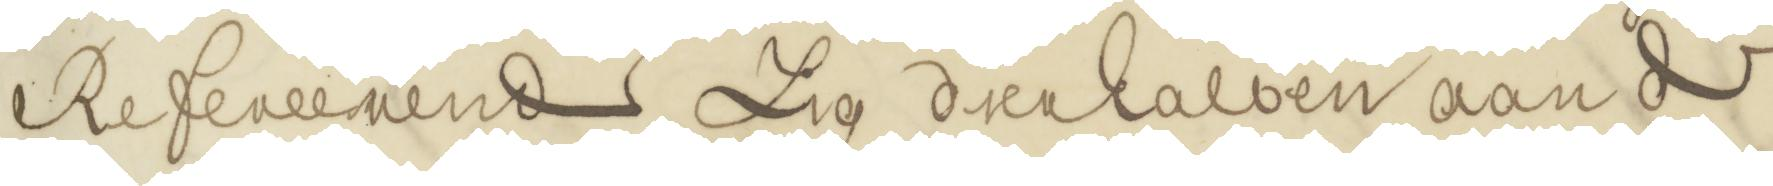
Refereerende zig dierhalven aan de
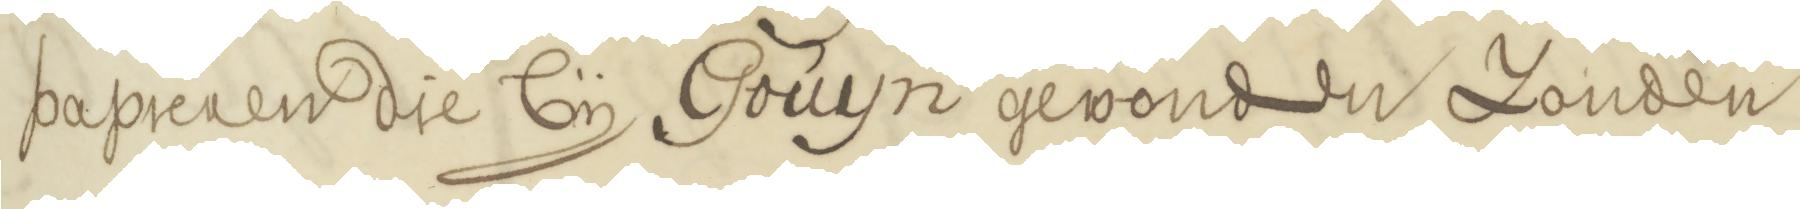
papieren die bij Gouyn gevonden Zouden
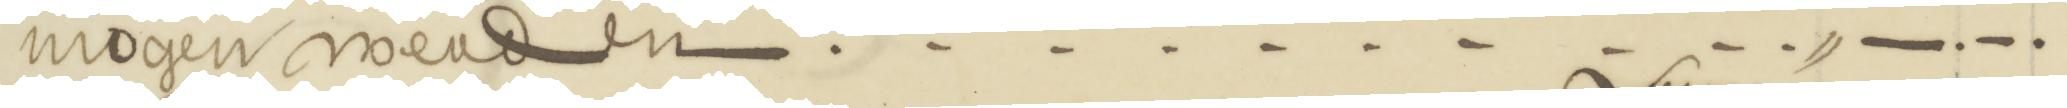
mogen werden. - - - - - - - - - - „–.–.
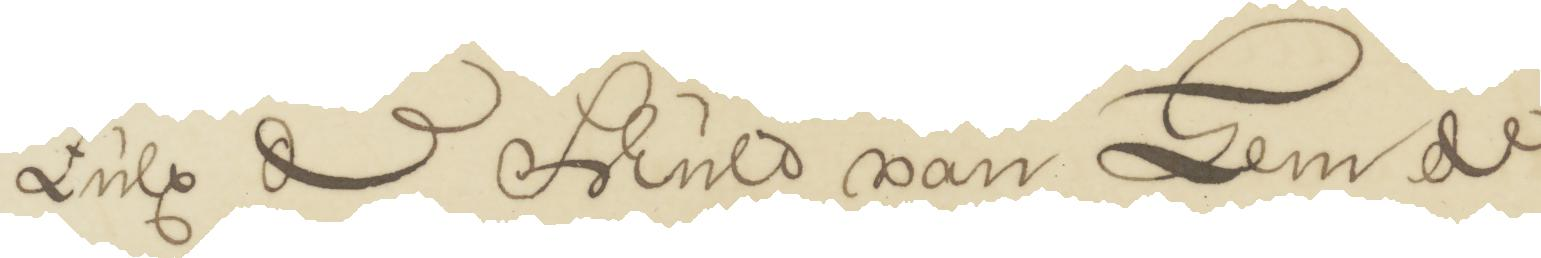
Zulx de schuld van hem de
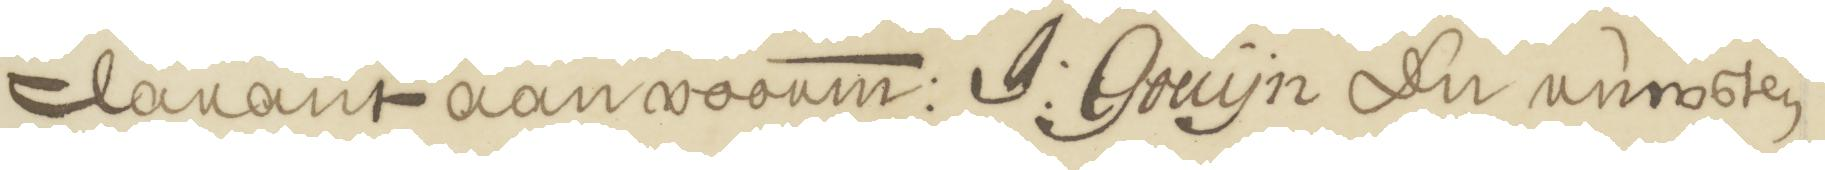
clarant aan voorm: G: Gouijn de nuwsten
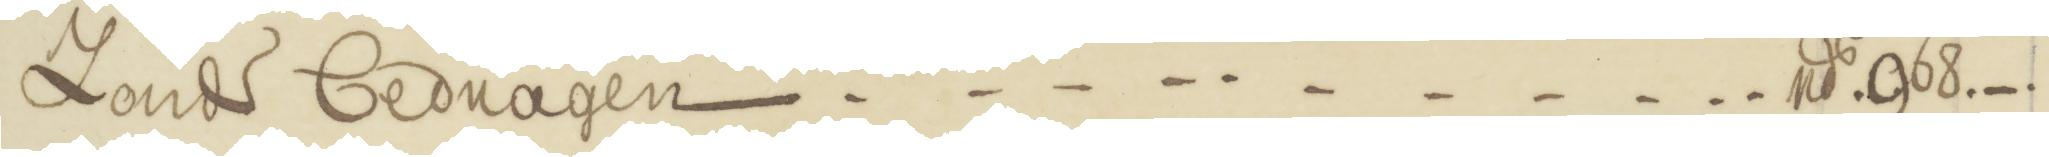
zoude bedragen - - - - - - - - - - -rd.s 968.–.
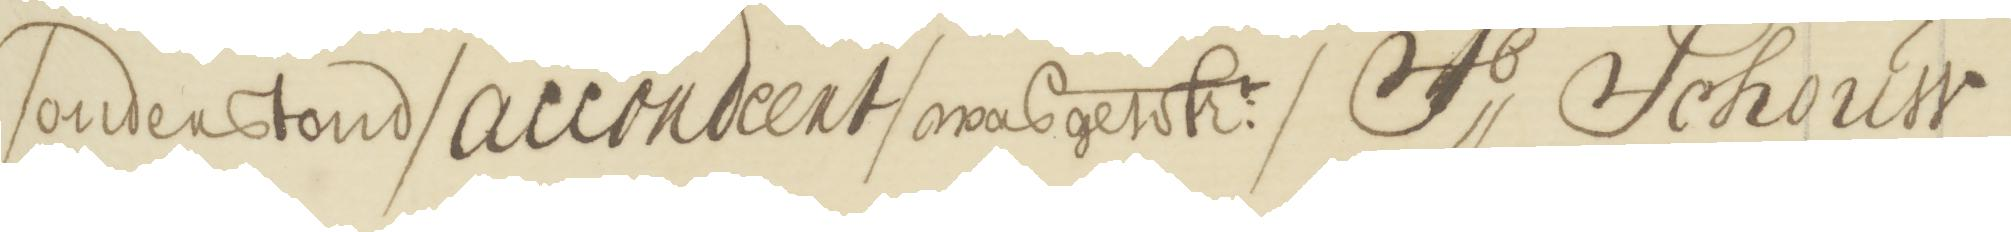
/onderstond/accordeert /was getek:t/ J„b Schouw
